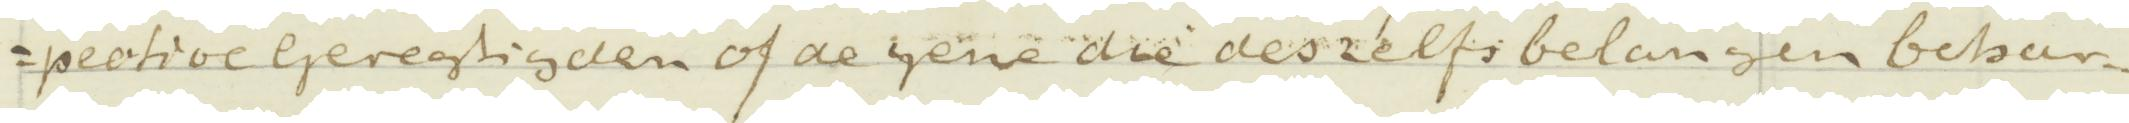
=pective Geregtigden of de gene die deszelfs belangen behar=
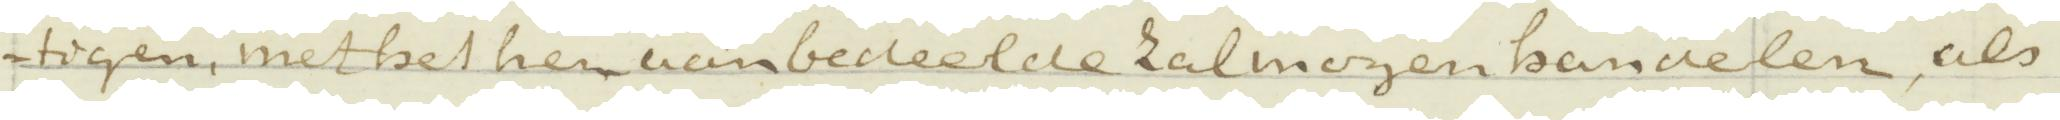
=tigen met het hen aanbedeelde zal mogen handelen, als
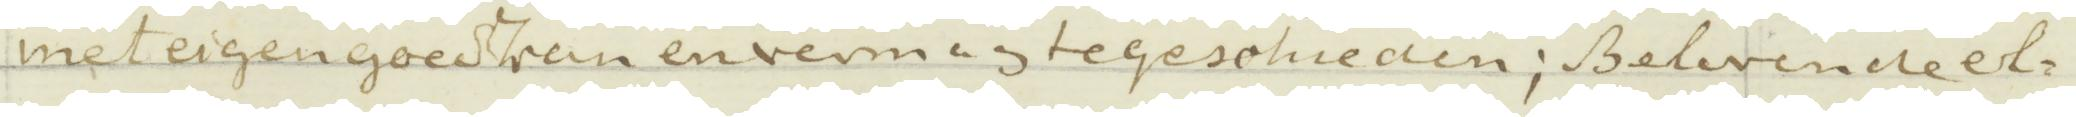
met eigen goed kan en vermag te geschieden; Belovende el=
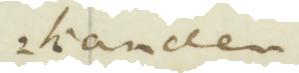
„kander
